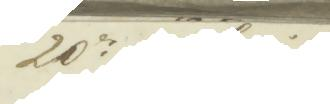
20:en Mei.
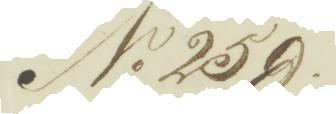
N.o 259.
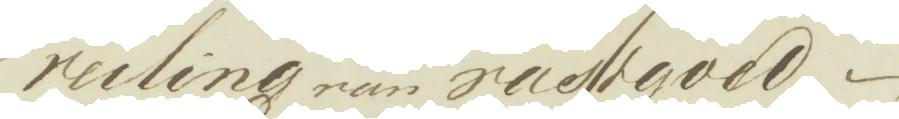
veiling van vastgoed.
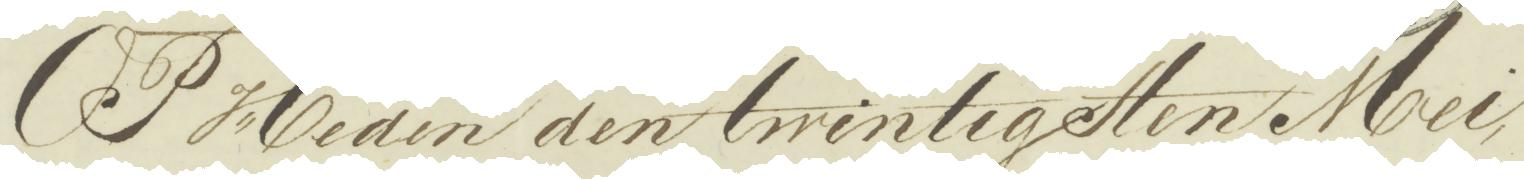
OP Heden den twintigsten Mei„
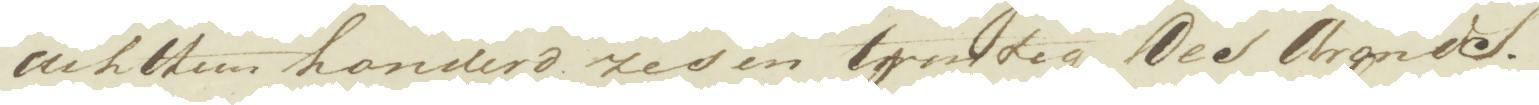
achttien honderd zes en twintig Des Avonds.
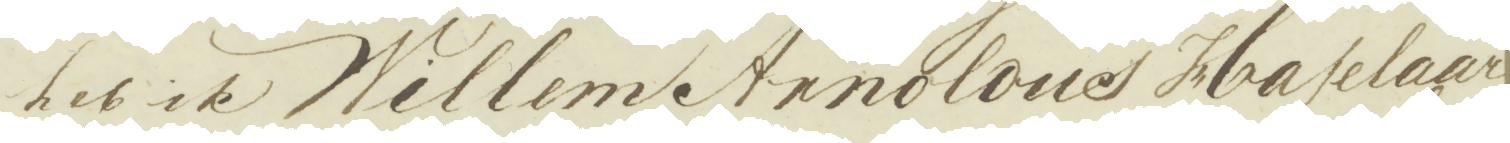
heb ik Willem Arnoldus Haselaar
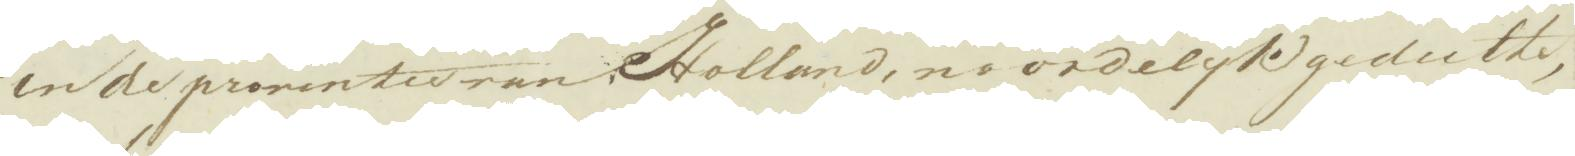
in de provintie van Holland, noordelyk gedeelte,
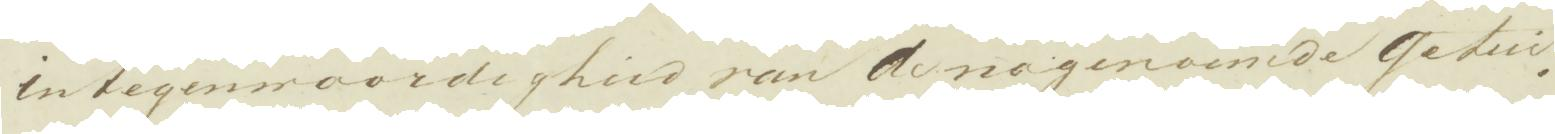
in tegenwoordigheid van de nagenoemde Getui„
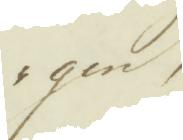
„gen,
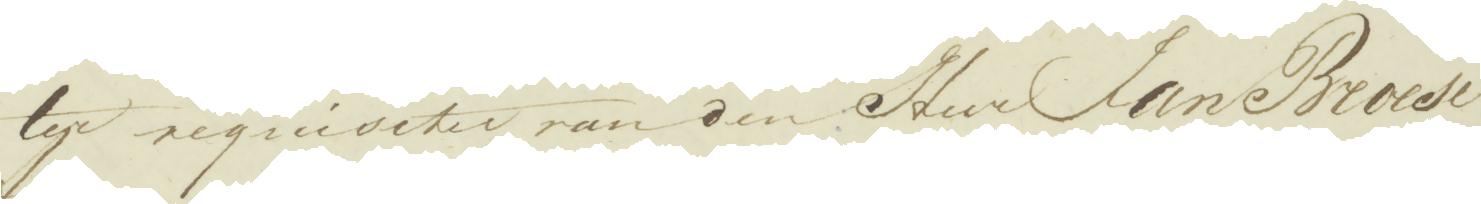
ten requisite van den Heer Ian Broese
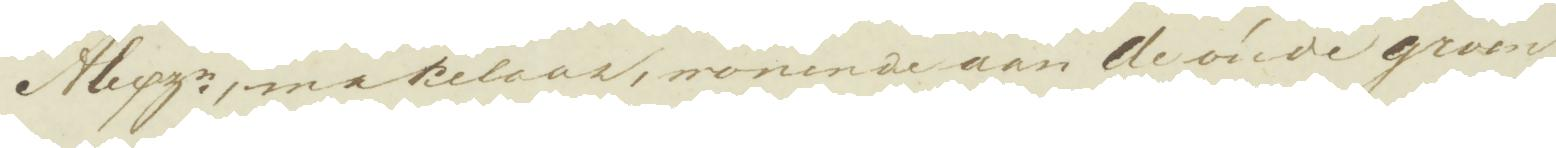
Alexz.n, makelaar, wonende aan de oude groen
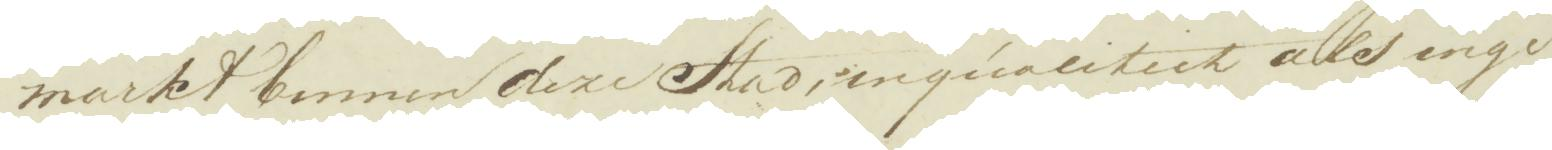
markt binnen deze Stad, in qualiteit als inge
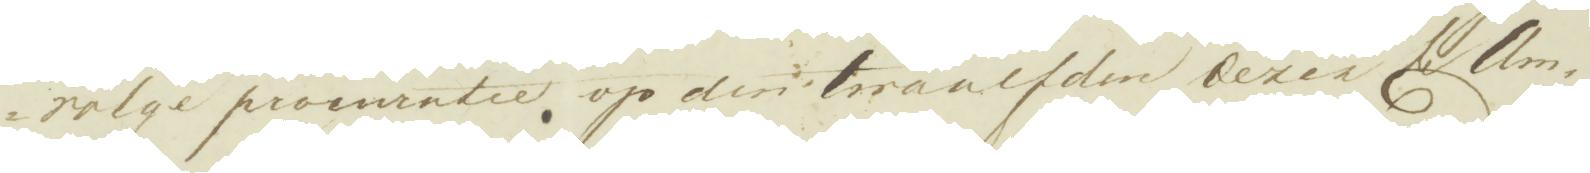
„volge procuratie, op den twaalfden dezen te Am„
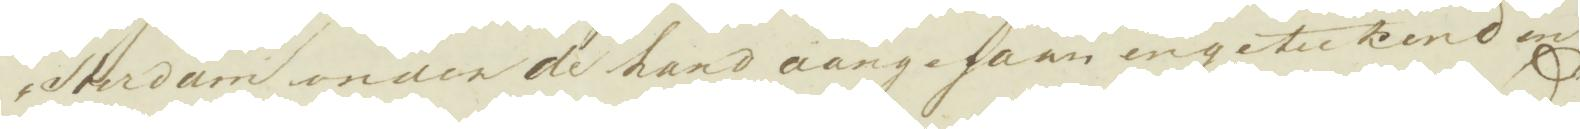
„sterdam onder de hand aangegaan en geteekend en
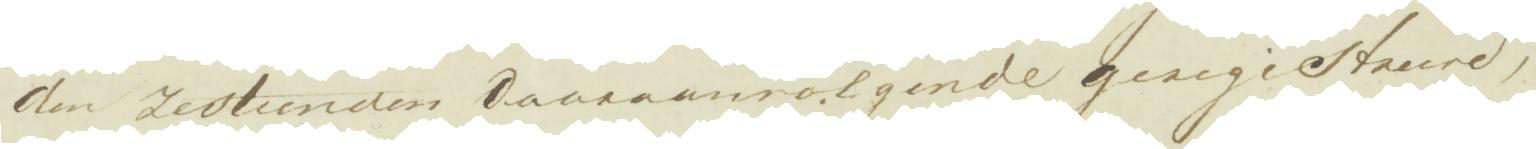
den zestienden daaraan volgende geregistreerd,
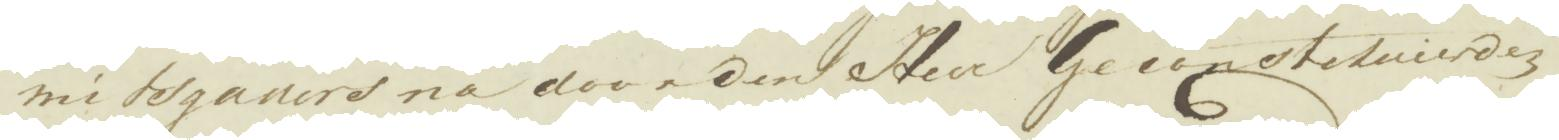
mitsgaders na door den Heer Geconstitueerde
